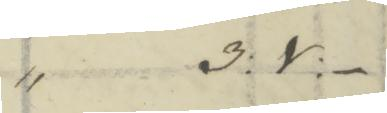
„ 3:1:—
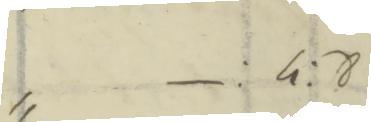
„ —:4:8
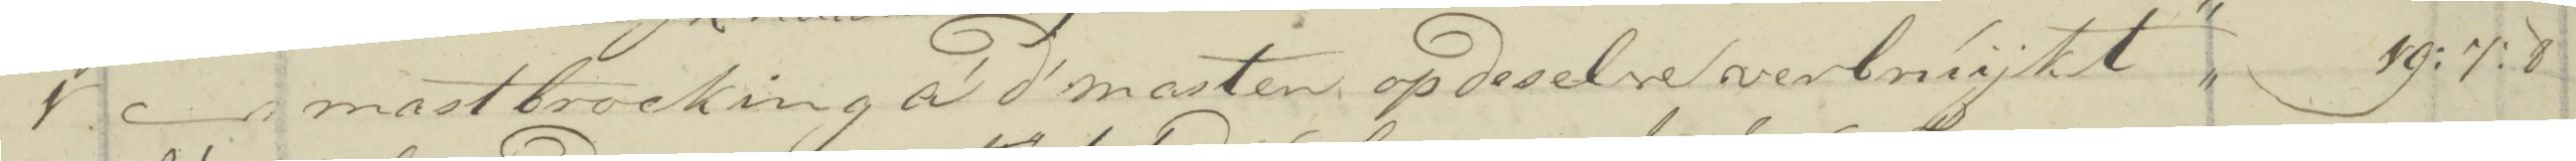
1 —: mastbroeking a' d' masten op deselve verbruijkt „ 19:7:8
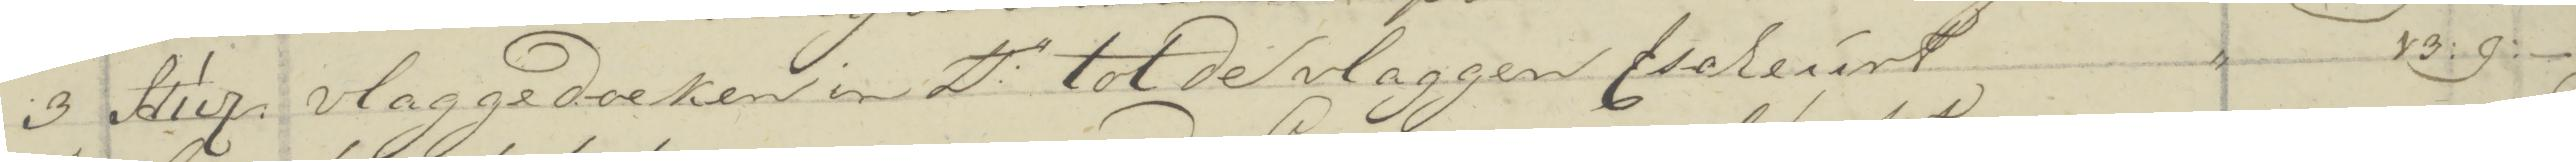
3 stux: vlaggedoeken in D:o tot de vlaggen Verscheurt „ 13:9:—
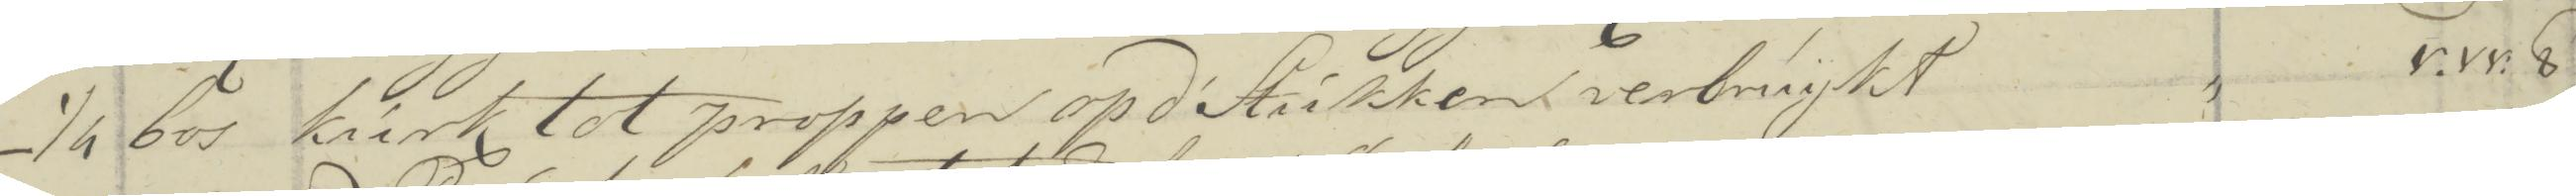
—¼ bos kurk tot proppen op d' stukken verbruijkt „ 1:11:8
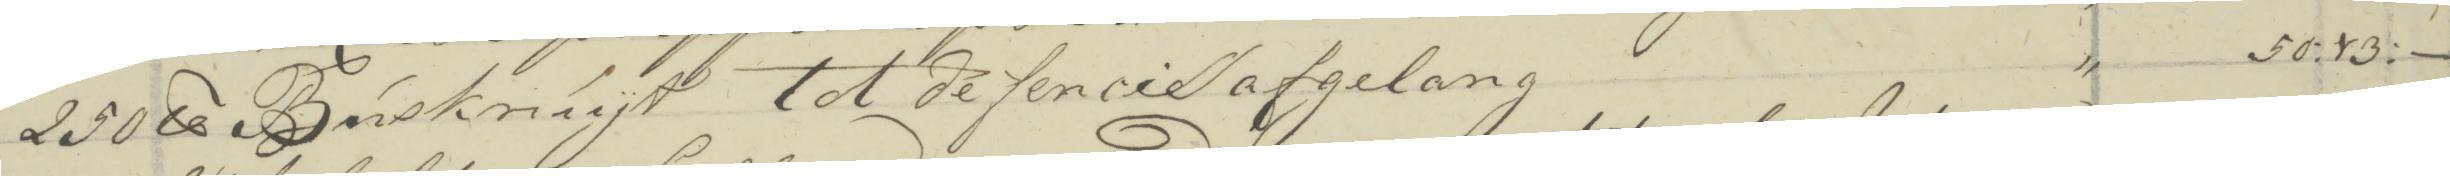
250 lb Buskruijt tot defencies afgelang „ 50:13:—
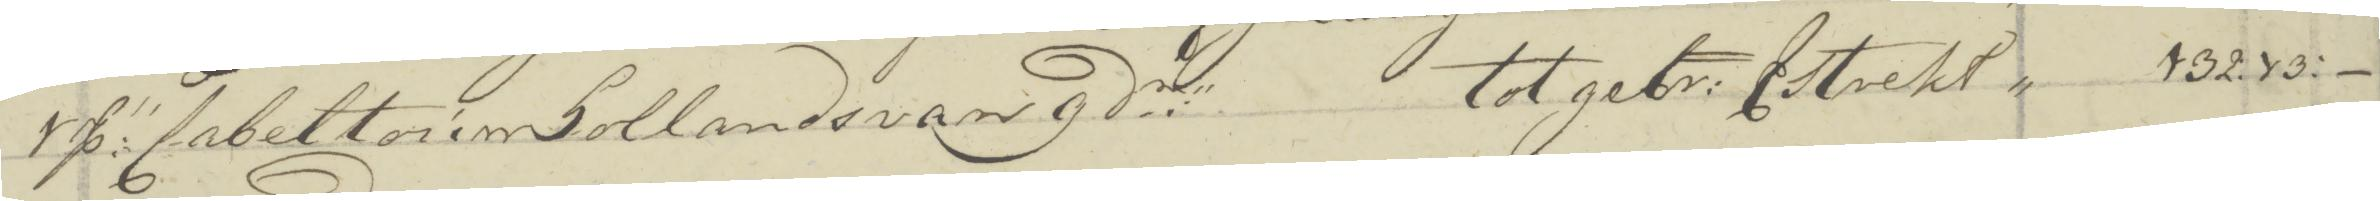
1 p:" Cabeltouw Hollands van 9 d=m" tot gebr: Verstrekt 132:73:—
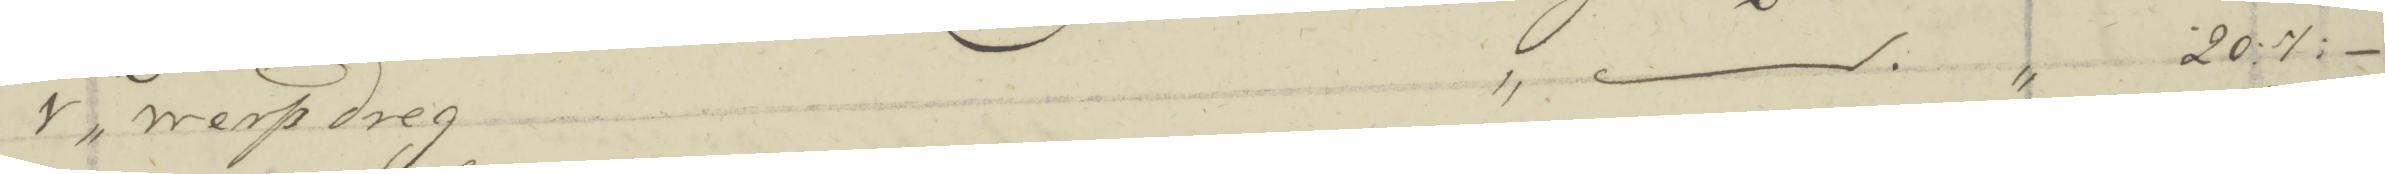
1„ werp dreg „ —: „ 20:7:—
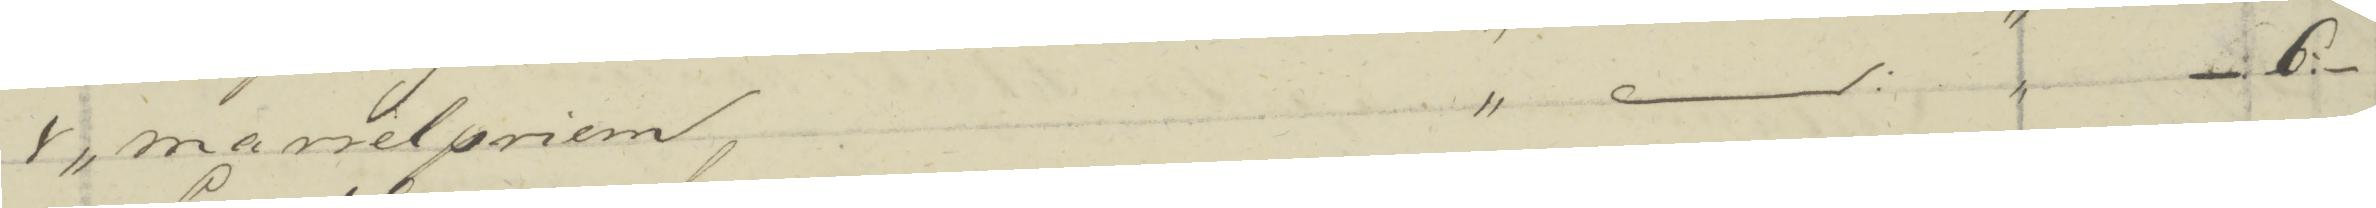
1„ marrelpriem „ —: —:6:—
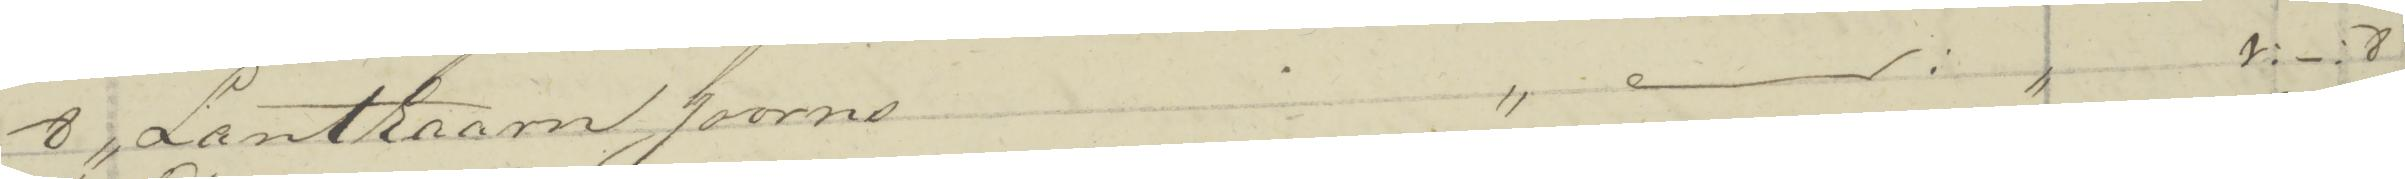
8„ Lanthaarn Hoorns „ —: „ 1:—:8
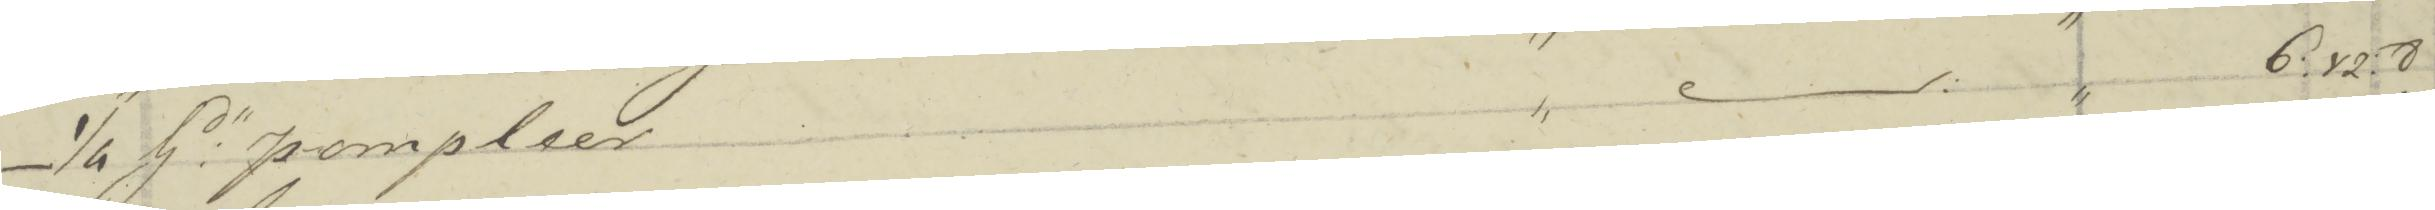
—¼ H:d„ pompleer „—: „ 6:12:8
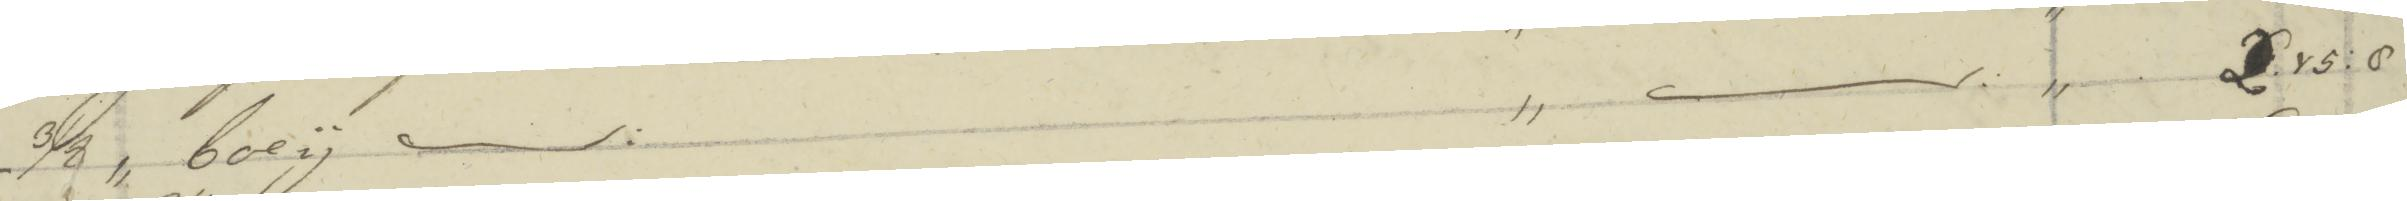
—3/8 „ boeij —: „ —: „ 2:15:8
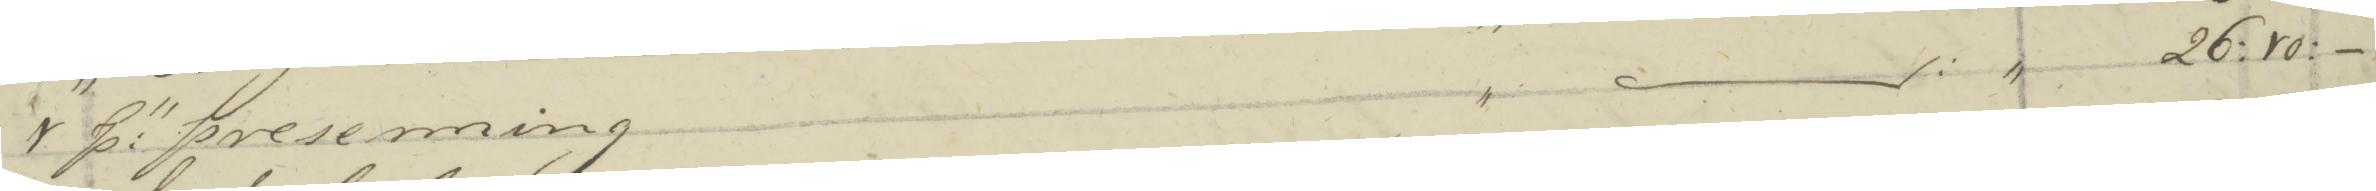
1 p:" presenning „ —: „ 26:10:—
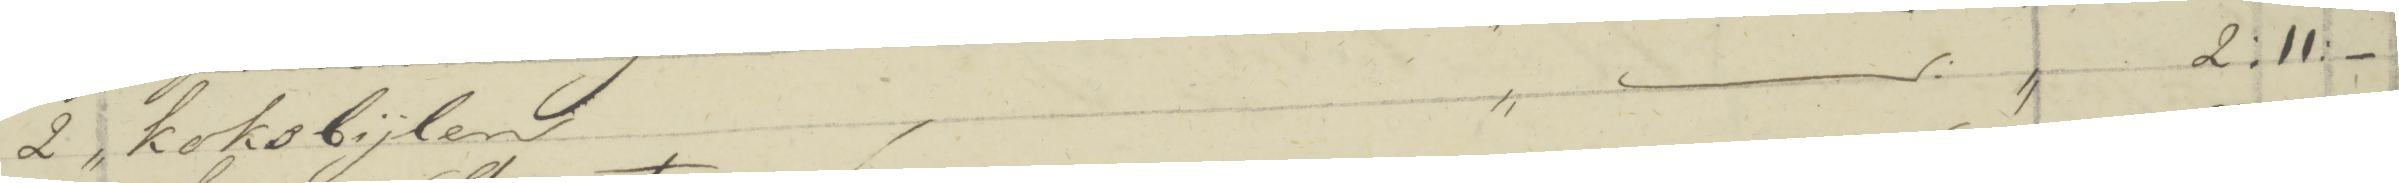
2 „ koksbijlen „ —: „ 2:11:—
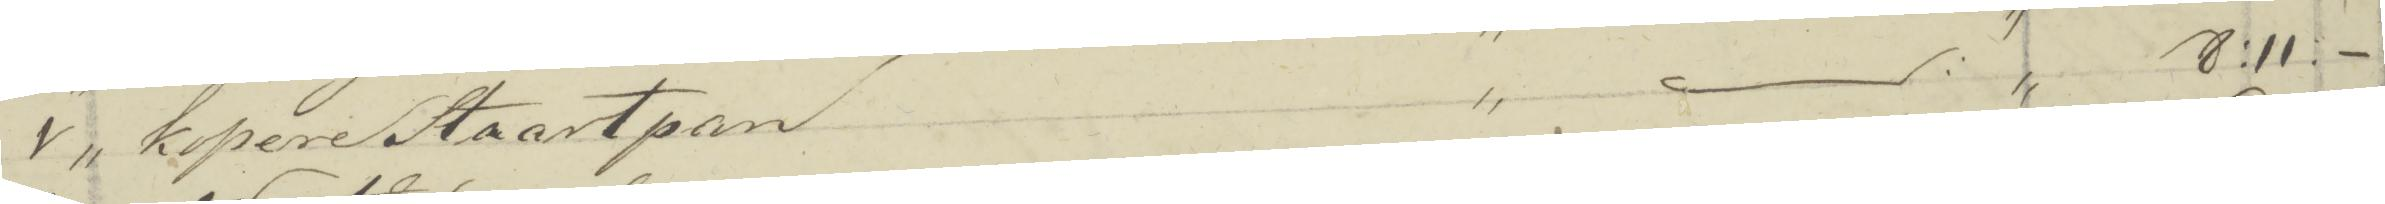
1„ kopere Staartpan „ —: „ 8:11:—
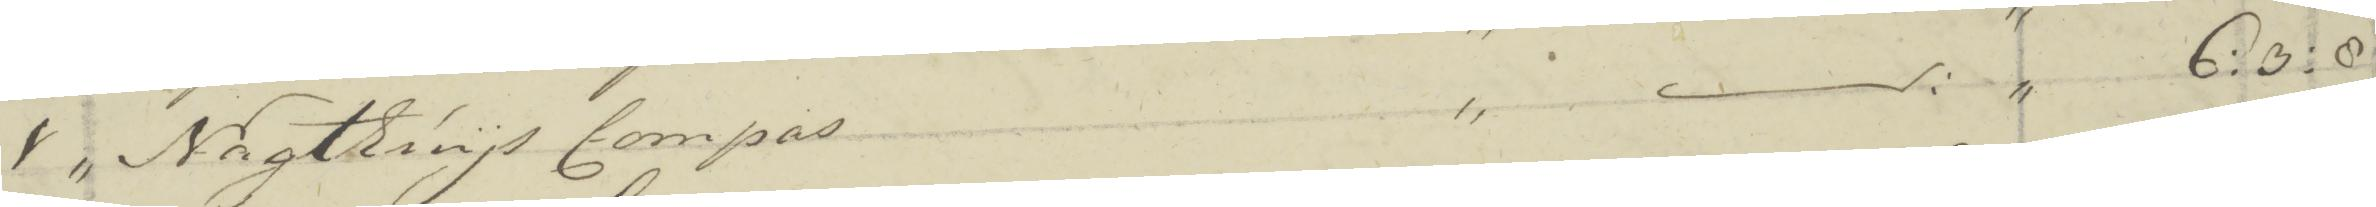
1„ Nagthuijs Compas „ —: „ 6:3:8
